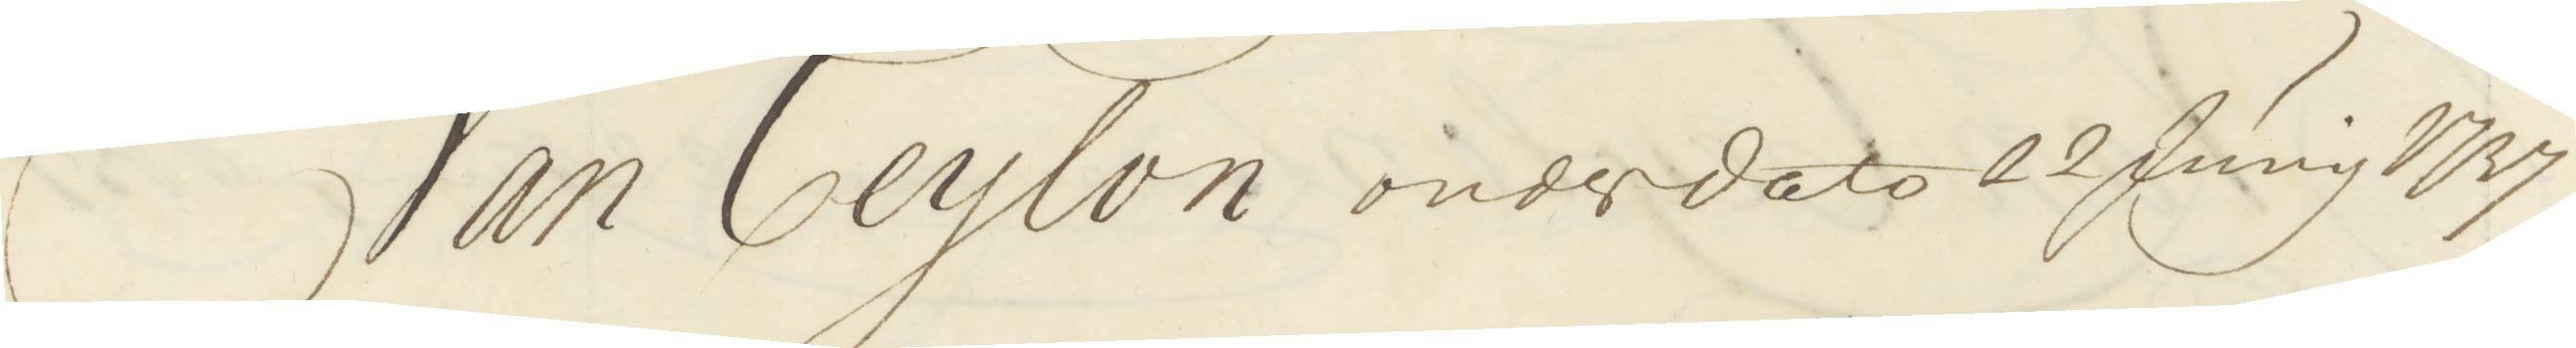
Van Ceylon onderdato 22 Junij 1737
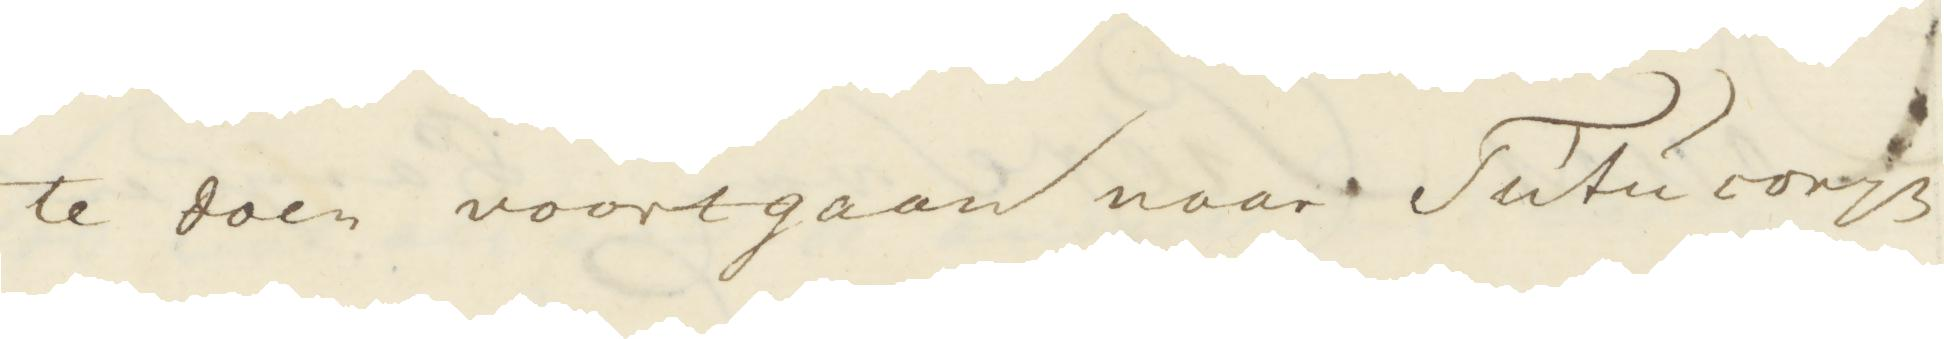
te doen voortgaan naar Tutucorijn
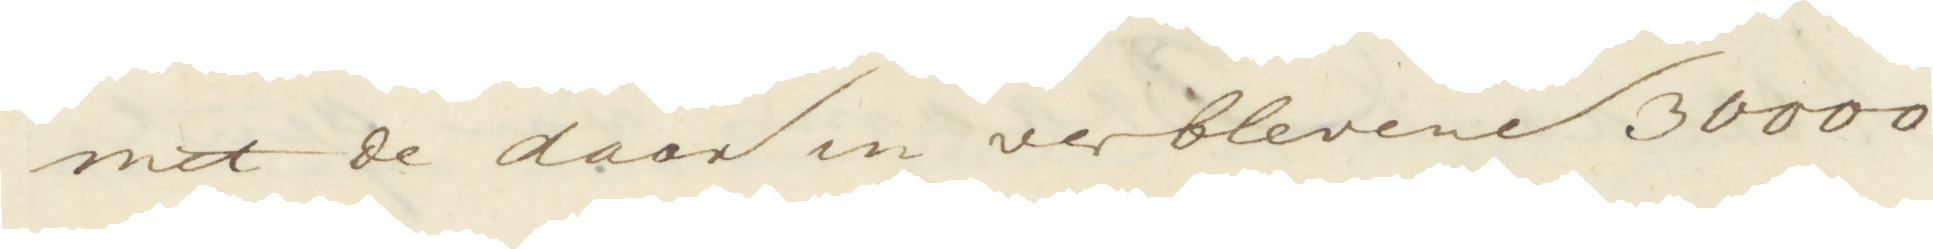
met de daar in verblevene 30000
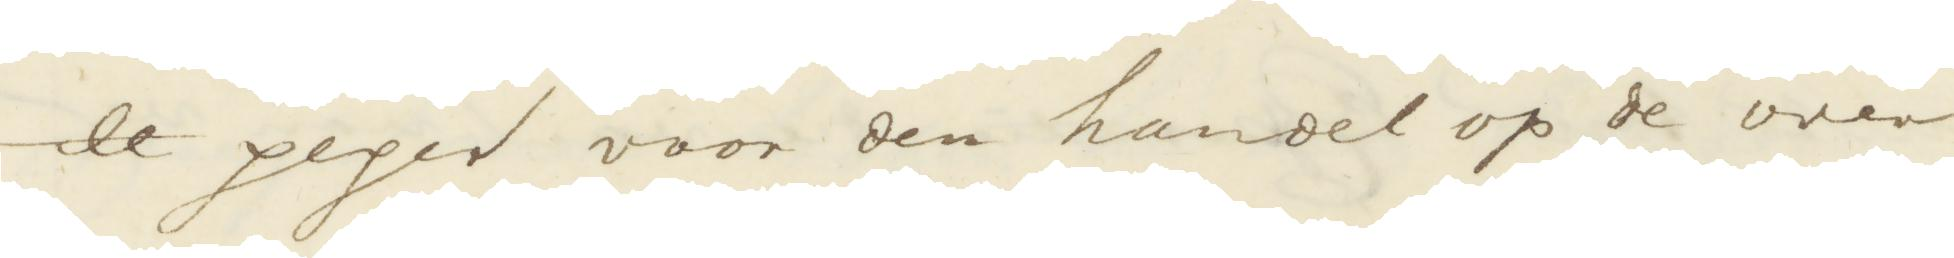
lb peper voor den handel op de over
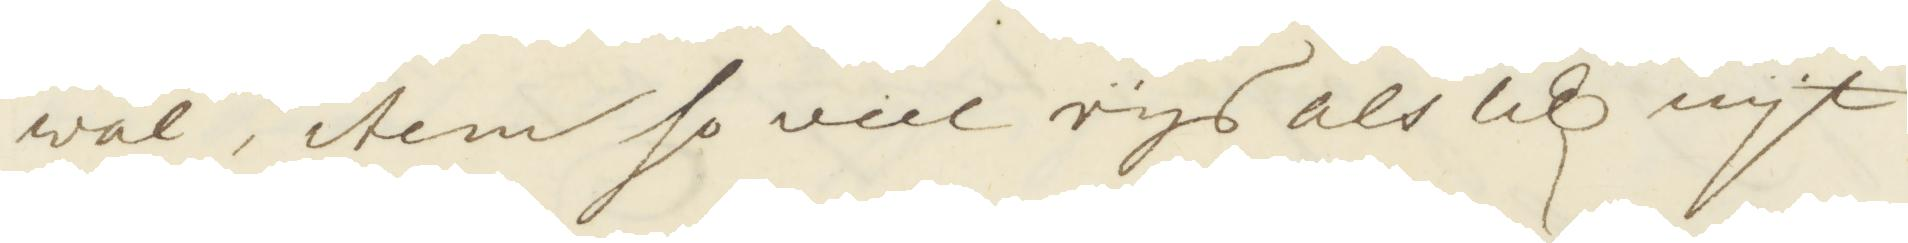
wal, item so veel rijs als uE uijt
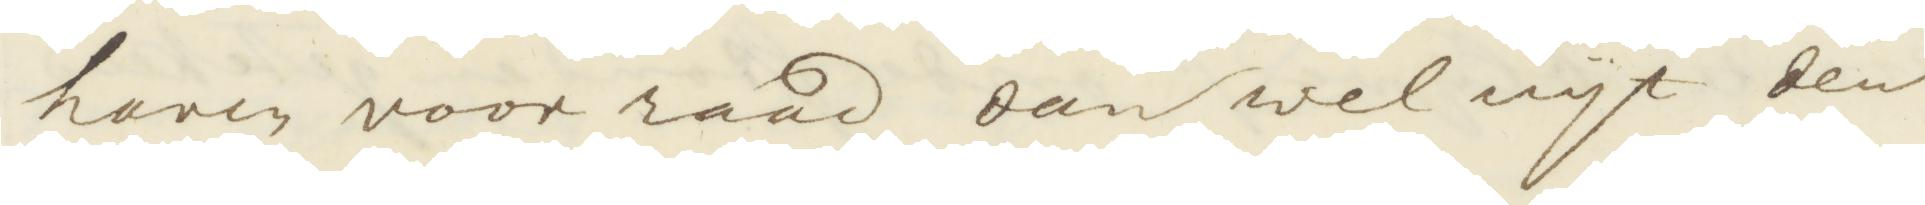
haren voor raad dan wel uijt den
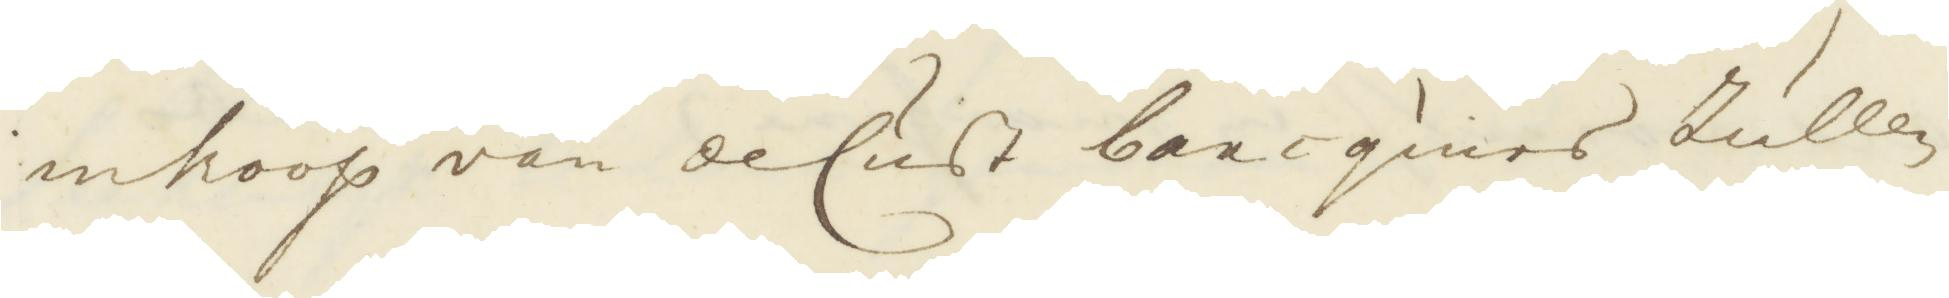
inkoop van de Cust barcquirs zullen
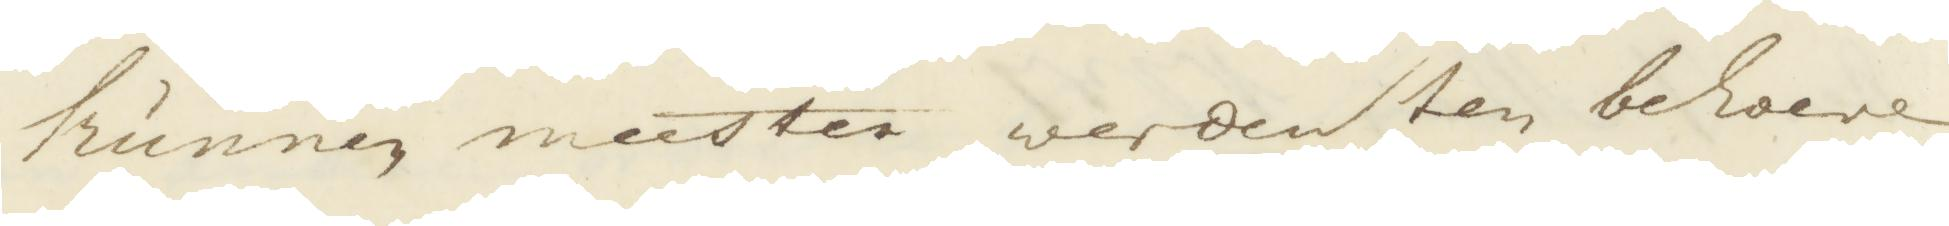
kunnen meester werden ten behoeve
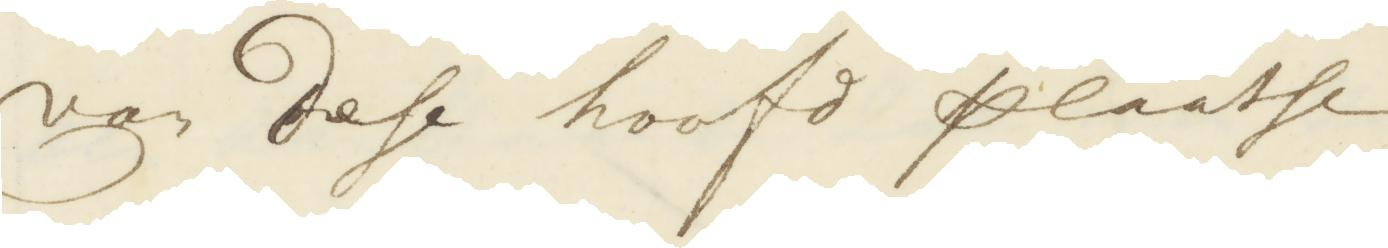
van dese hoofd plaatse
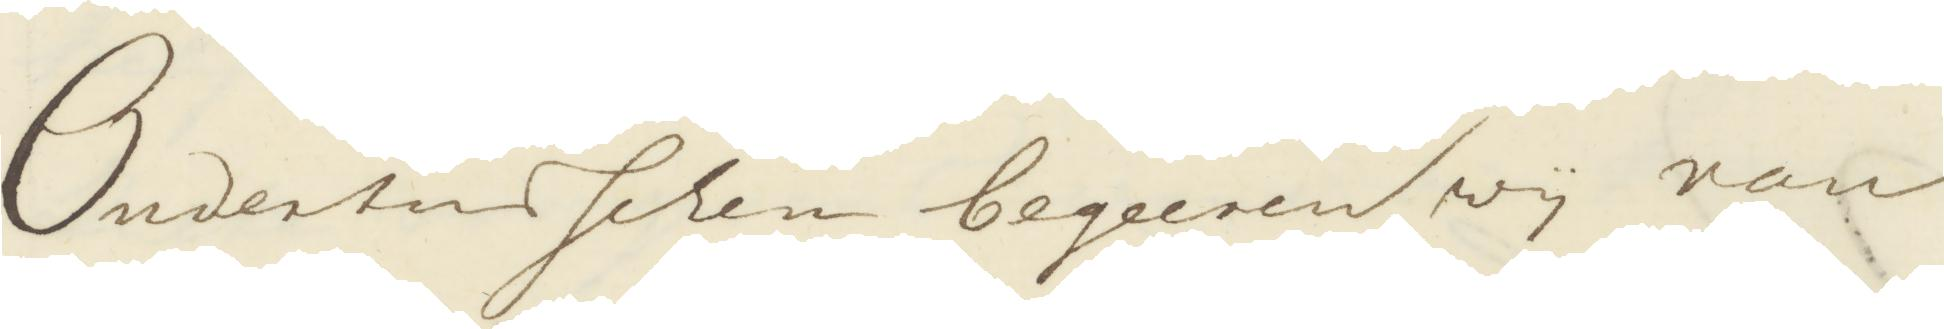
Ondertusschen begeeren wij van
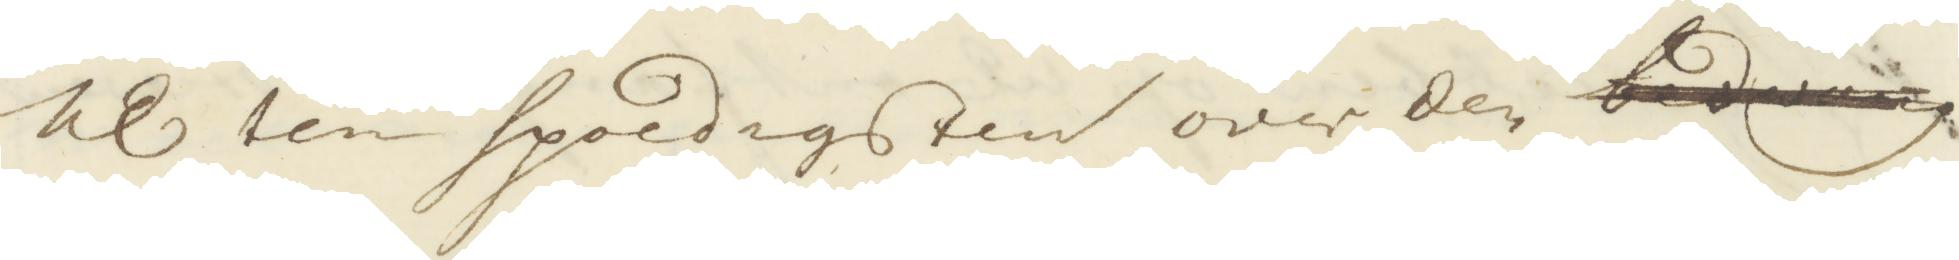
UE ten spoedigsten over den bedearg
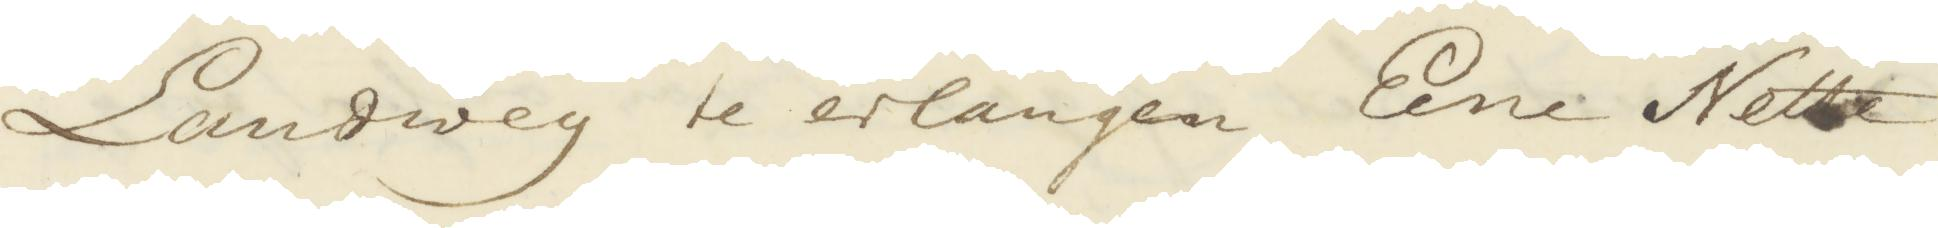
Landweg te erlangen Eene Nette
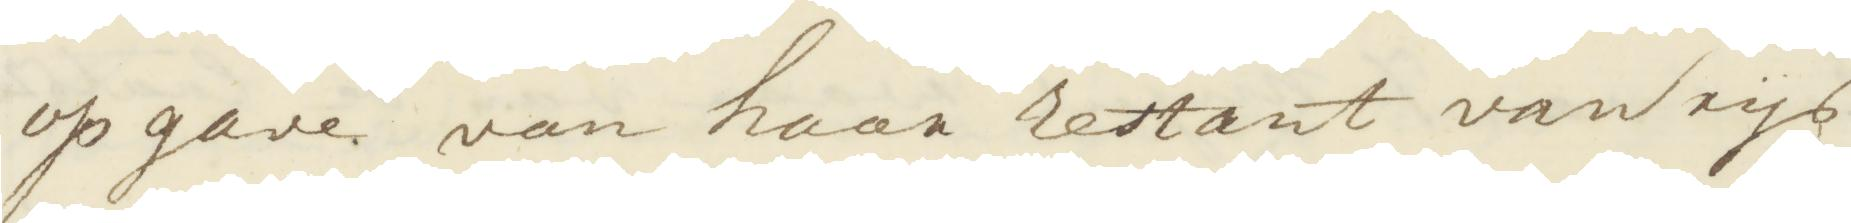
opgave van haar restant van rijs
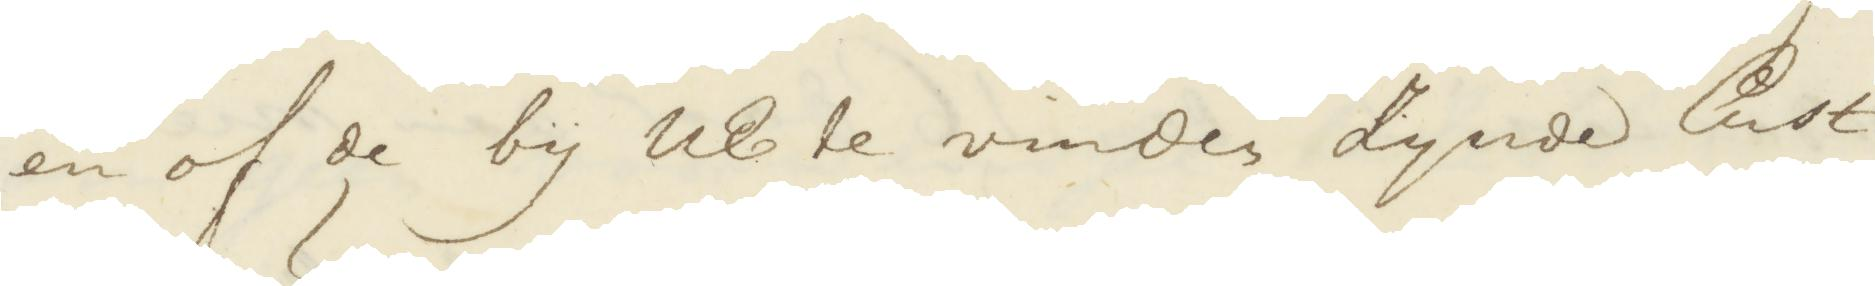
en of de bij UE te vinden zijnde Cust
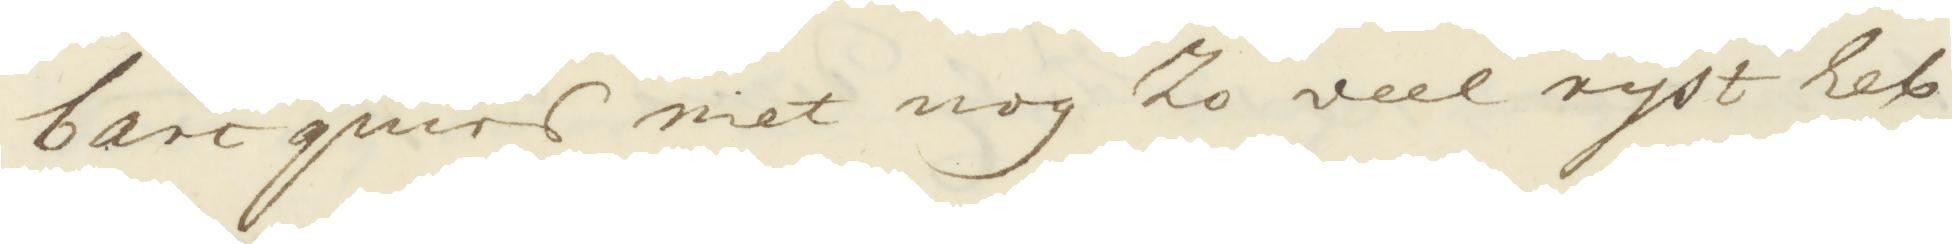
barcquirs niet nog zo veel rijst heb
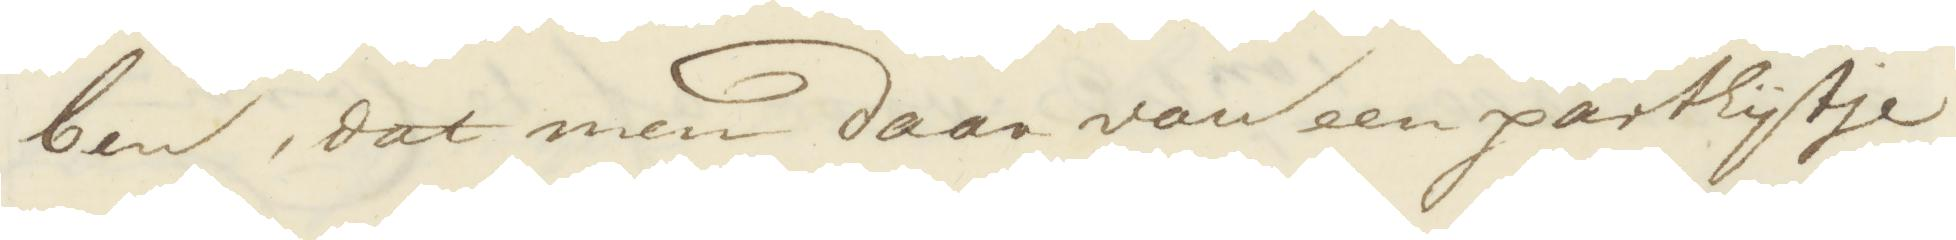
ben, dat men daar van een parthijtje
